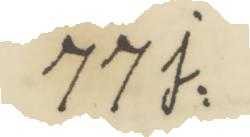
771:
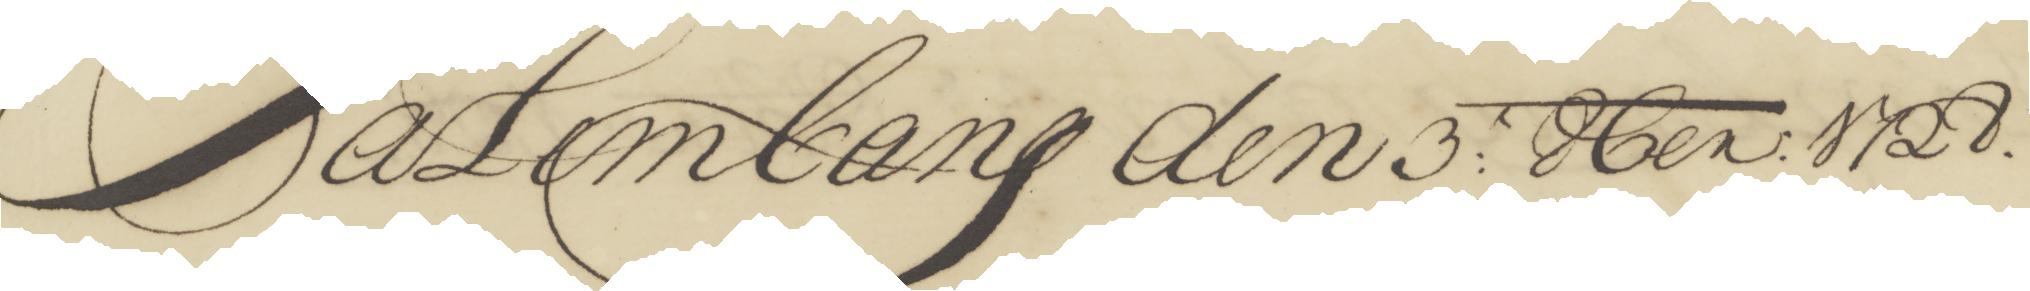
Palembang den 3:en 8ber: 1728.
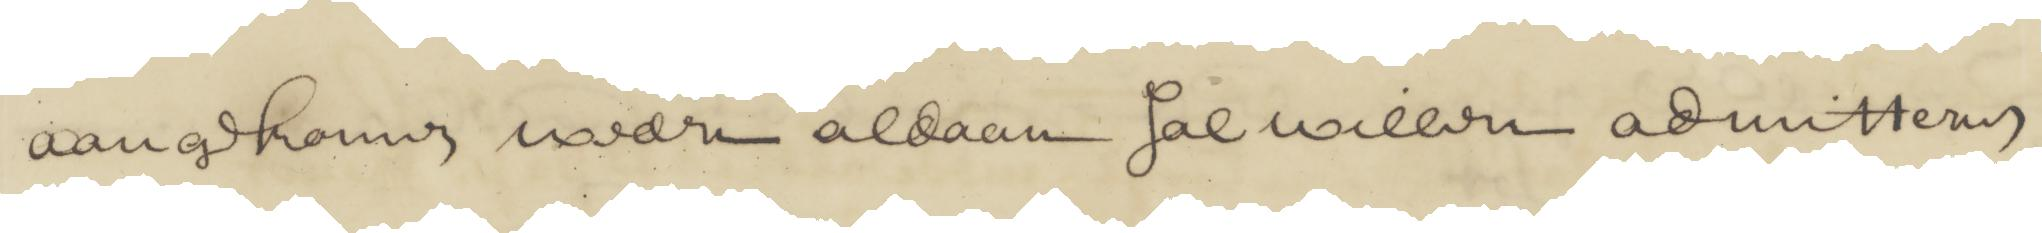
aangekomen weder aldaar sal willen admitteren
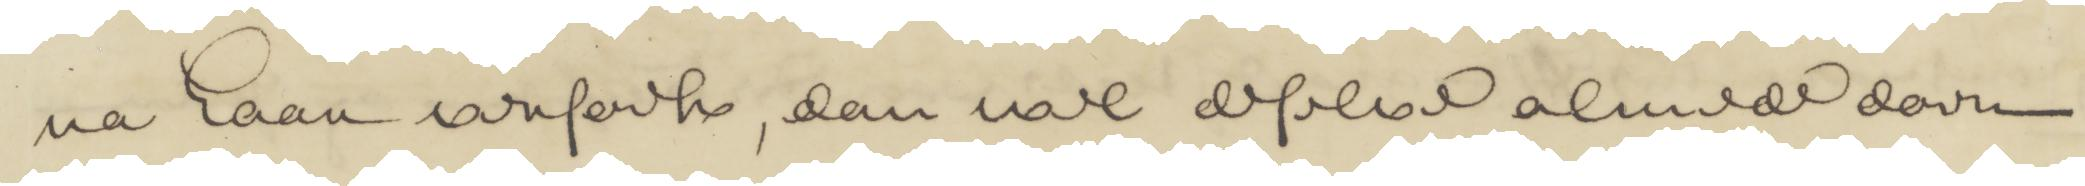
na haar versoek, dan wel deselve almede doen
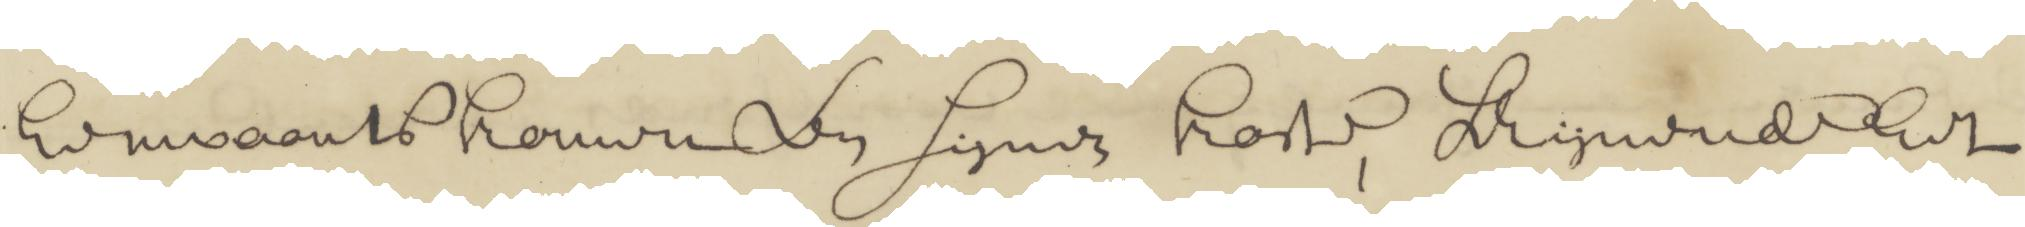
herwaarts komen ten sijner koste, schijnende het
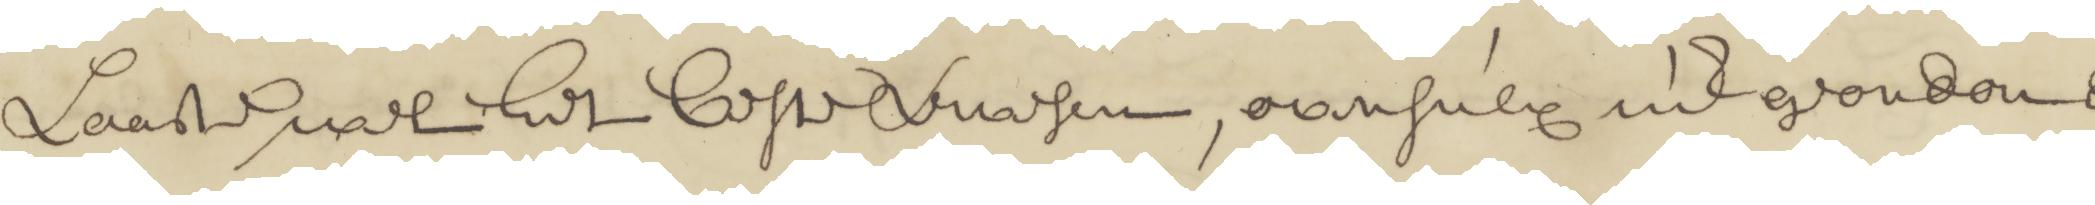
laaste wel het beste te wesen, oversulx uE geordon
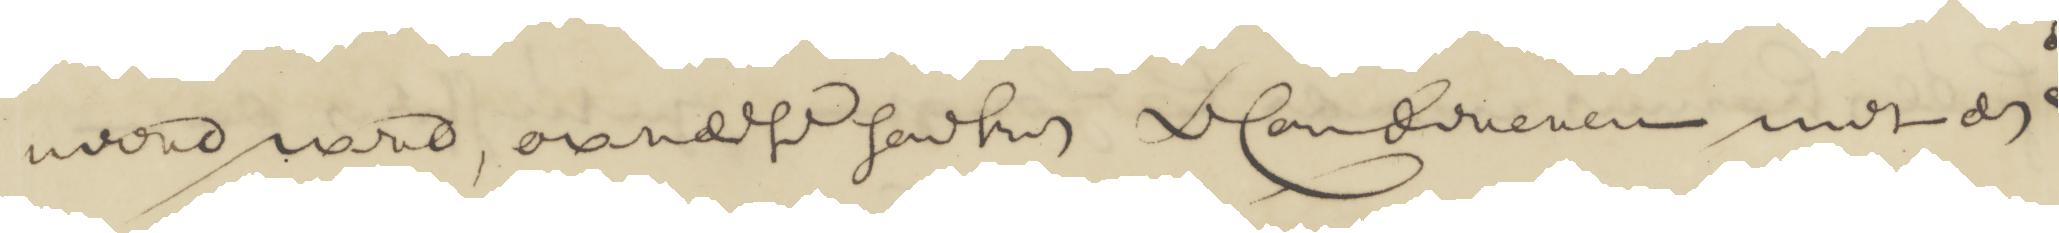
neerd werd, overdese saeken te confereren met den
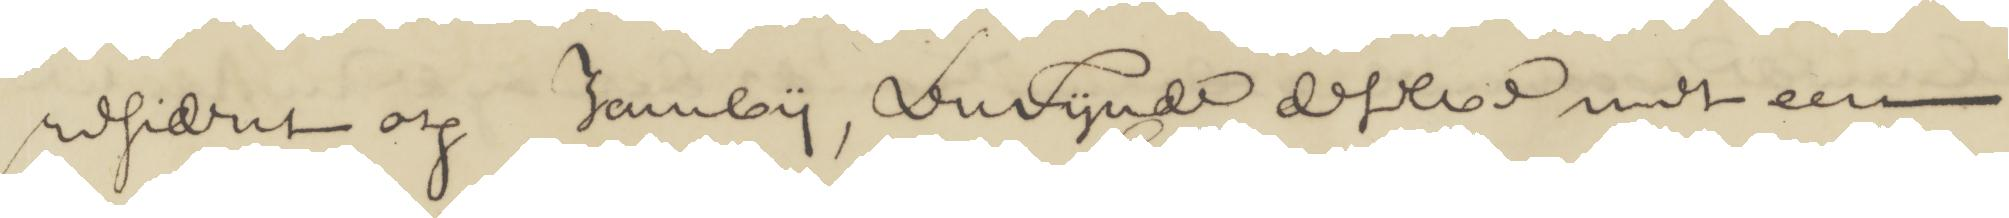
resident op Jambij, ten Eijnde deselve met een
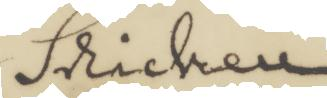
schicken
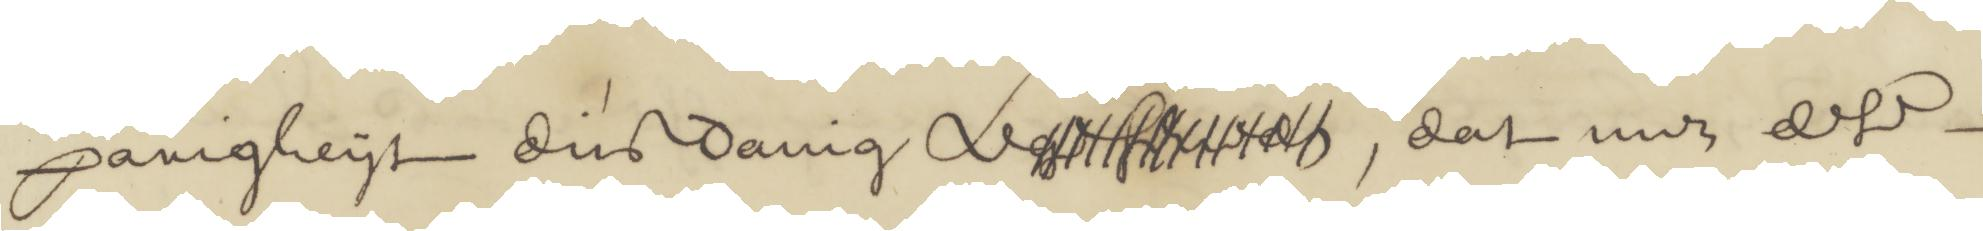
parigheijt dusdanig te geschieden dat men dese
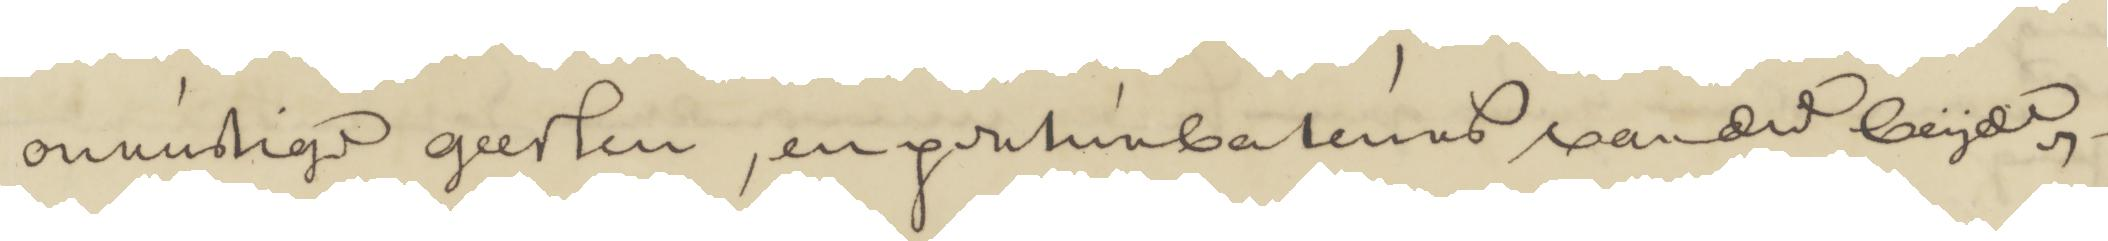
onrustige geesten, en perturbateurs van die beijde
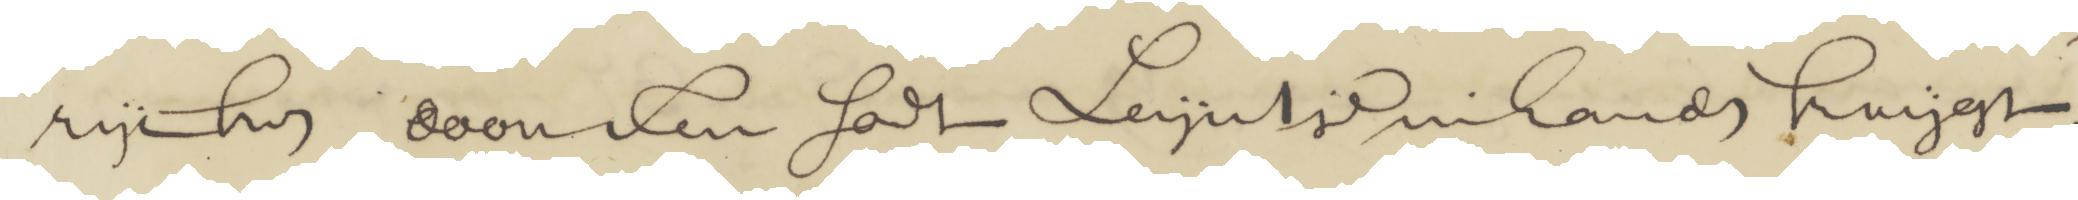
rijcken door Een soet Leijntje in handen krijgt
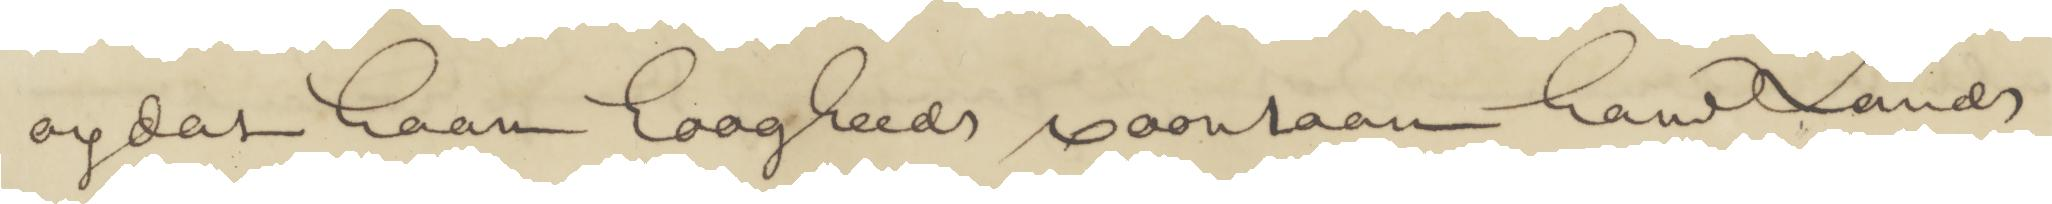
opdat haar hoogheeden voortaan hare Landen
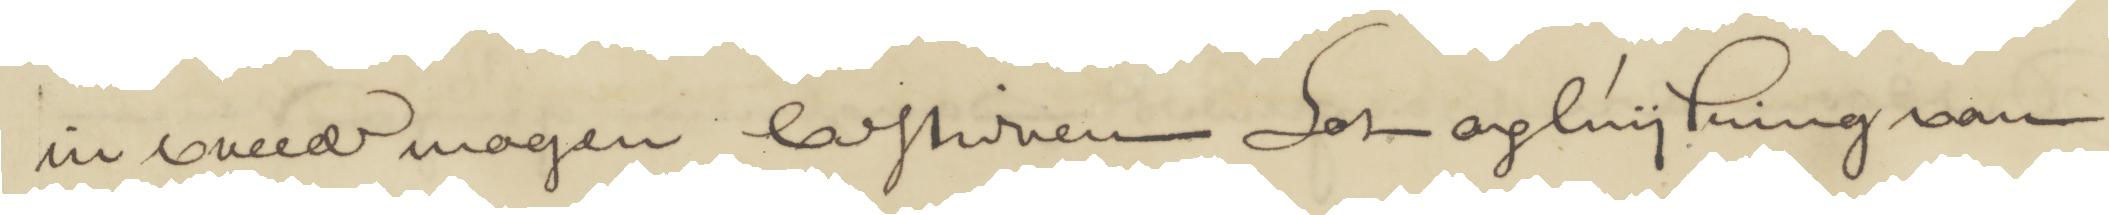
in vreede mogen bestieren tot opluijstring van
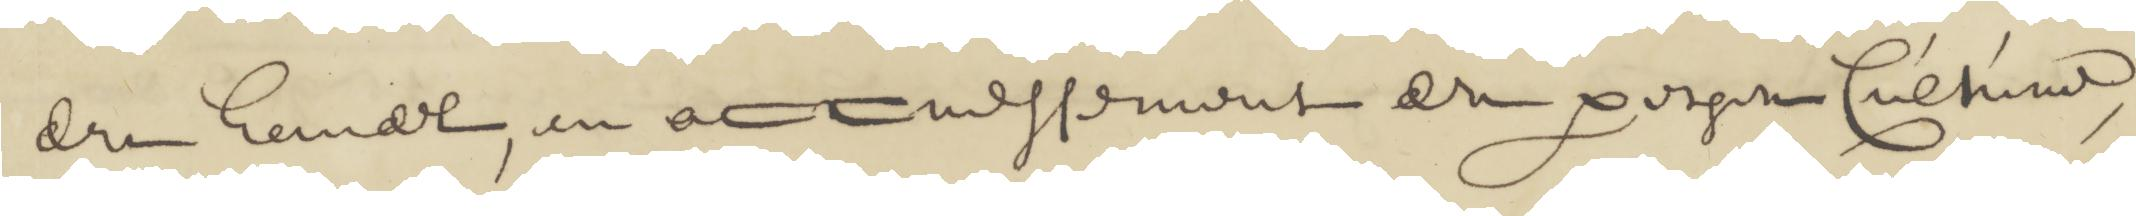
den handel, en accuessement der peper Culture,
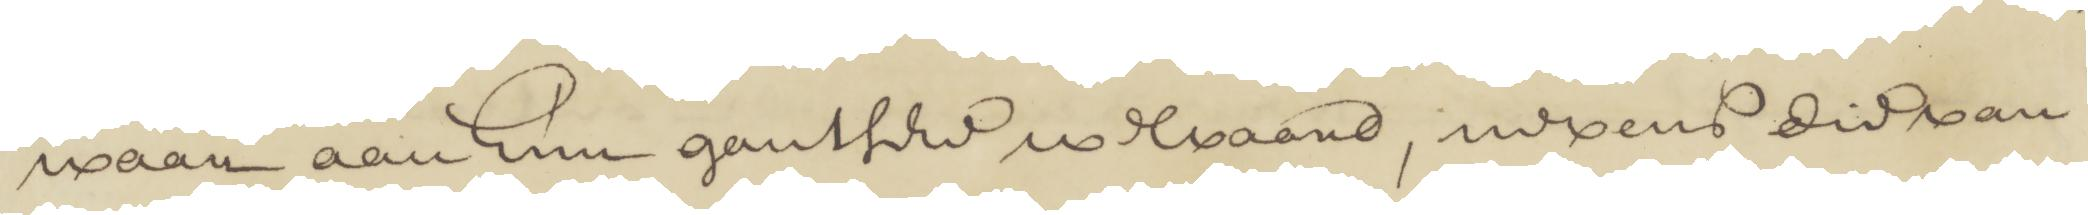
waar aan hun gantsche welvaard, nevens die van
